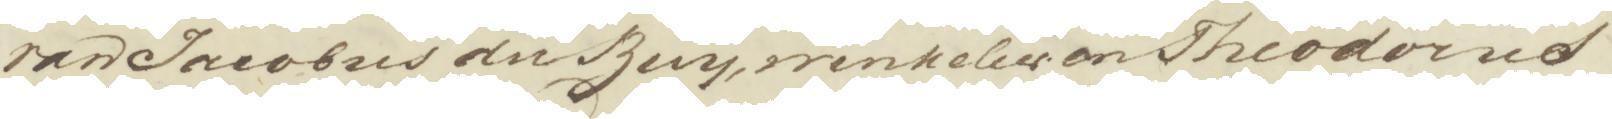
van Iacobus du Buy, winkelier en Theodorus
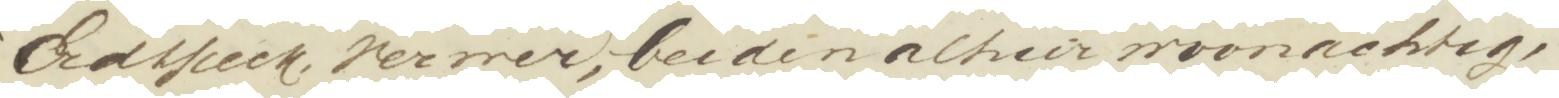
Erdtsieck, verwer, beiden alhier woonachtig,
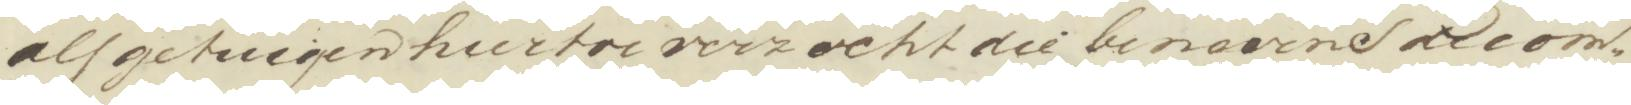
als getuigen hiertoe verzocht die benevens de com„
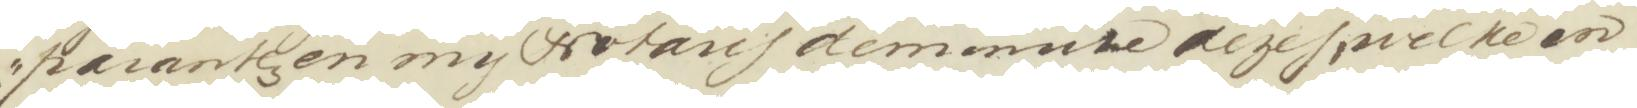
„paranten en my Notaris de minute dezes, welke in
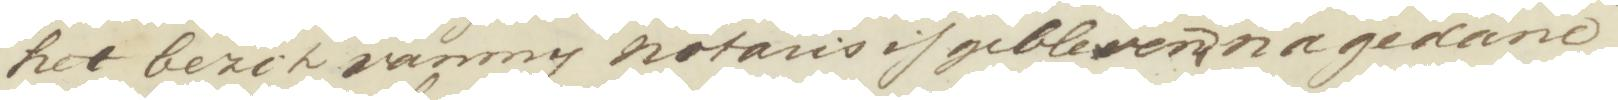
het bezit van my notaris is gebleven na gedane
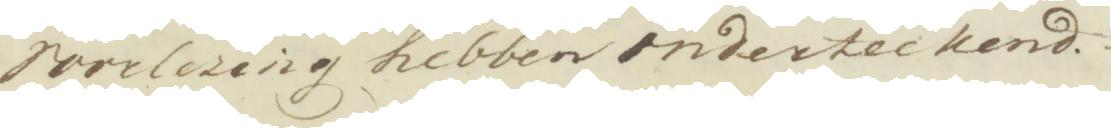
Voorlezing hebben onderteekend.
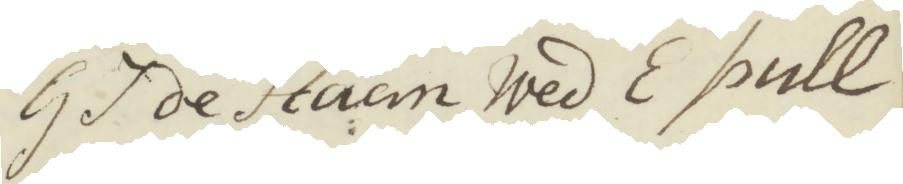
G. J. de Haan Wed E Pull
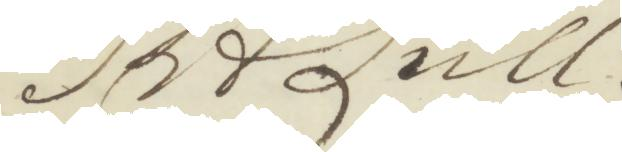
B A Pull
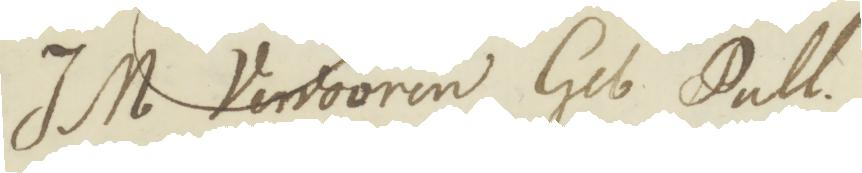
IM Vervooren Geb Pull.
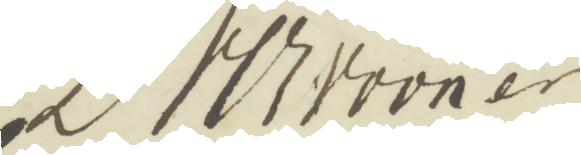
I D Vervooren
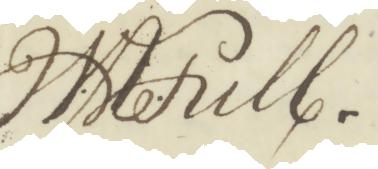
W. A. Pull.
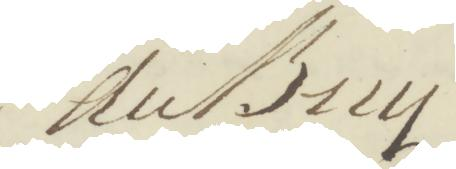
J. du Buy
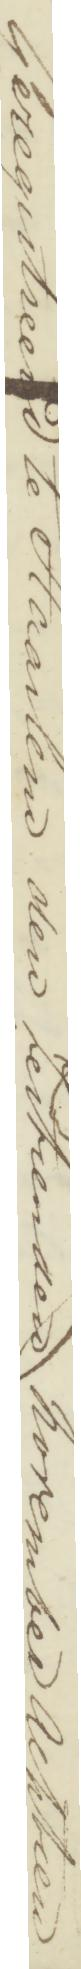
Geregistreerd te Haarlem den zestienden November Achtien
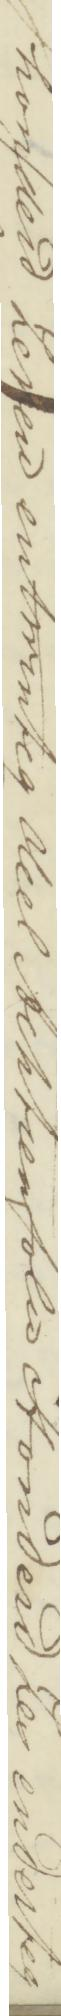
honderd zeven entwintig deel Achtien folio Honderd Zes en dertig
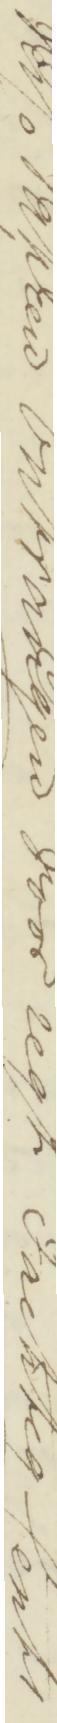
Verso Vak Een ontvangen voor regt Tachtig Cents
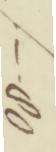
ƒ —. 80
